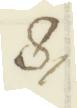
8,
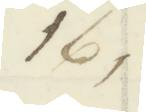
16,
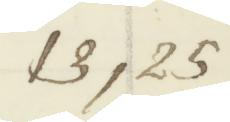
13,25
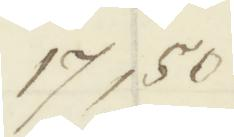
17 ,50
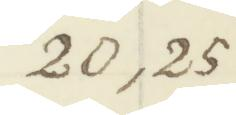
20 ,25
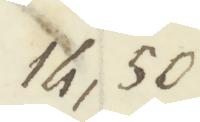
14,50
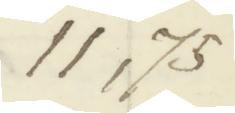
11 ,75
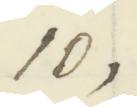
10,
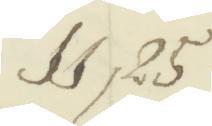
11,25
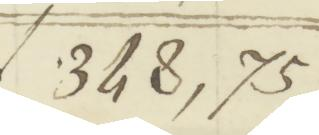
ƒ 348, 75
